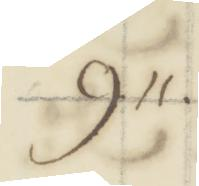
9. „
